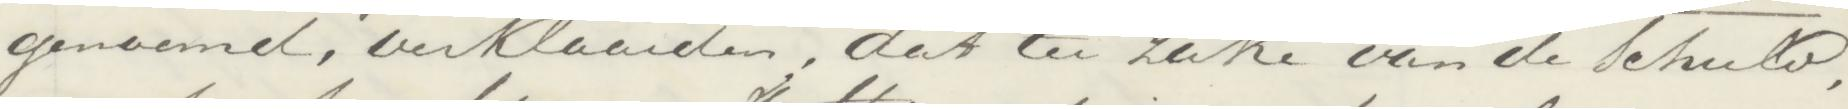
genoemd, verklaarden, dat ter zake van de schuld,
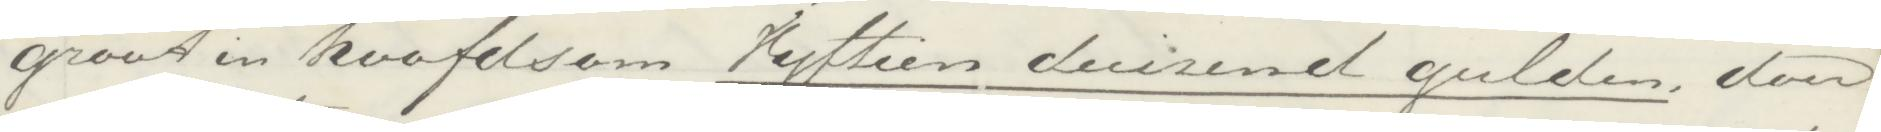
groot in hoofdsom Vyftien duizend gulden, door
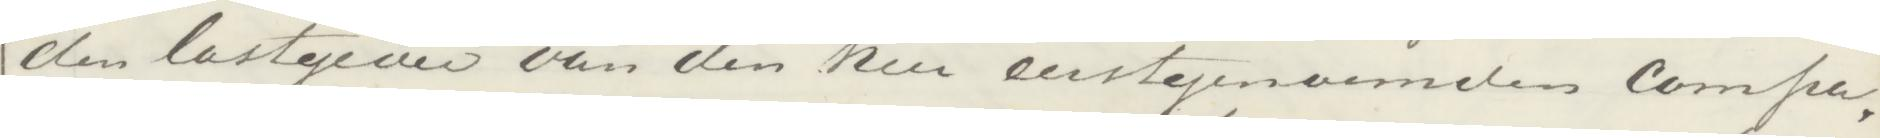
den lastgever van den Heer eerstgenoemden Compa„
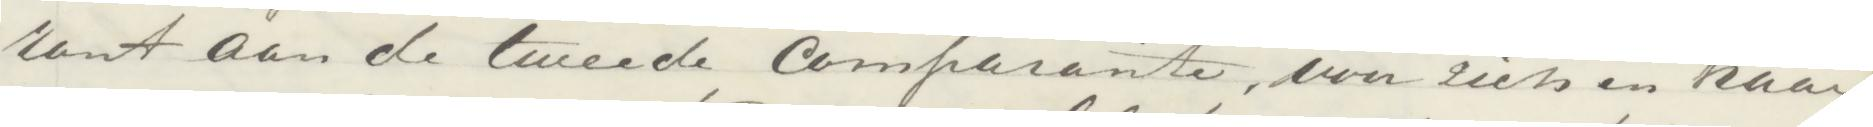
rant aan de tweede Comparante, voor zich en haar
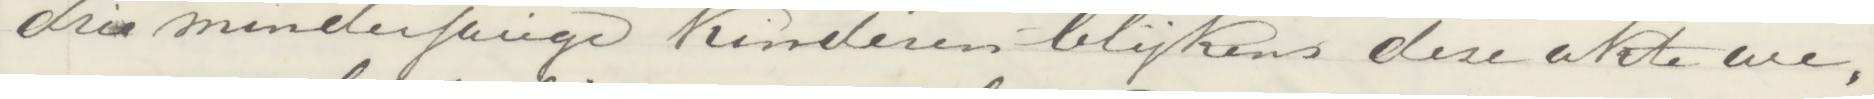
drie minderjarige Kinderen blijkens deze akte we„
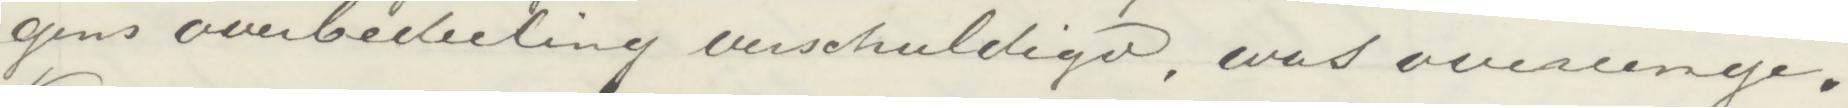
gens overbedeeling verschuldigd, was overeenge„
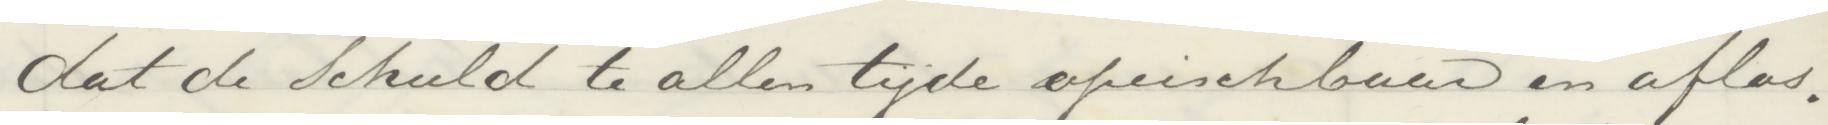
dat de schuld te allen tijde opeischbaar en aflos„
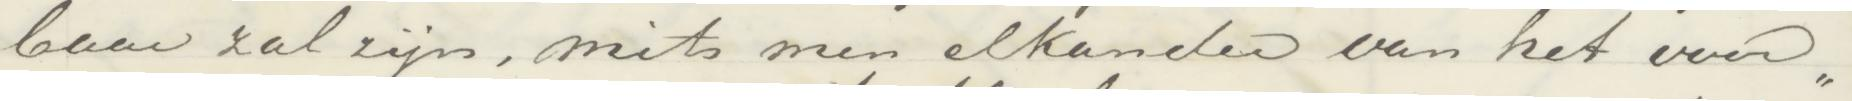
baar zal zijn, mits men elkander van het voor„
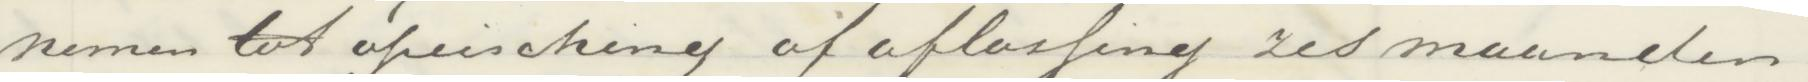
nemen tot opeisching of aflossing zes maanden
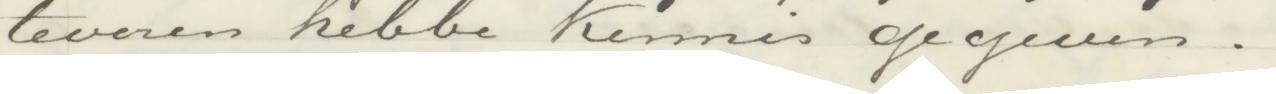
tevoren hebbe kennis gegeven.
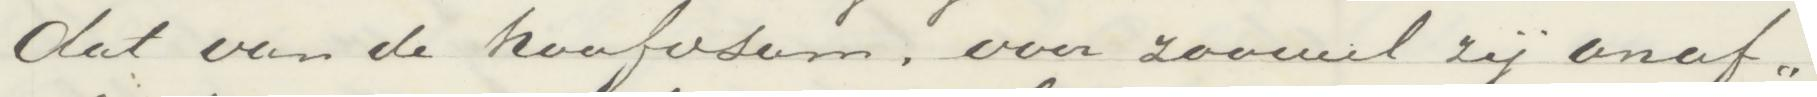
dat van de hoofdsom, voor zooeel zij onaf„
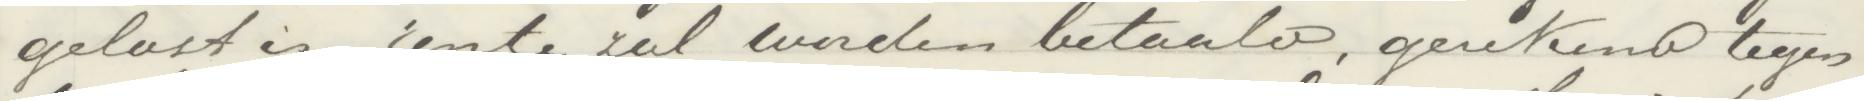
gelost is rente zal worden betaald, gerekend tegen
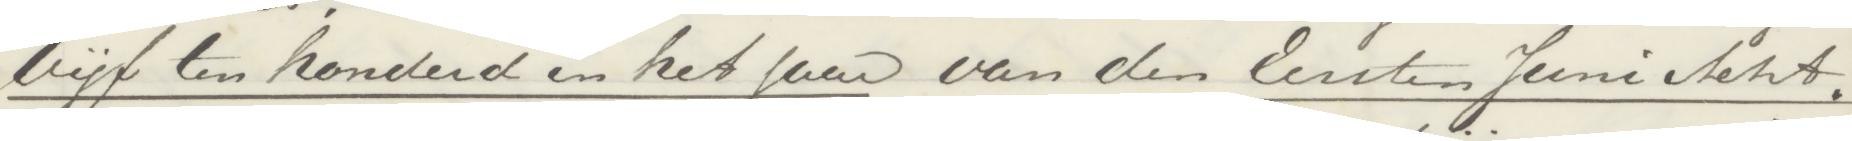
Vijf ten honderd in het jaar van den Eersten Juni Acht„
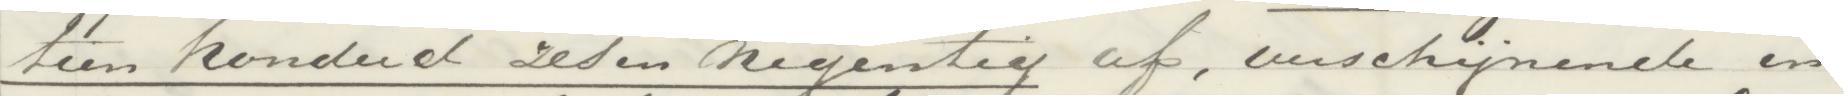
tien honderd zes en negentig af, verschijnende in
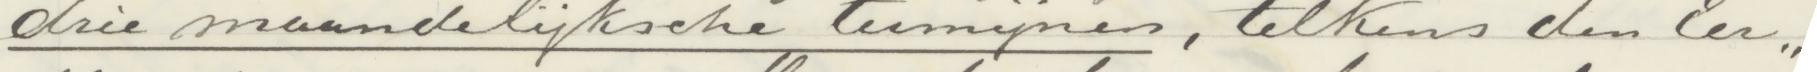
drie maandelijksche termijnen, telkens den Eer„
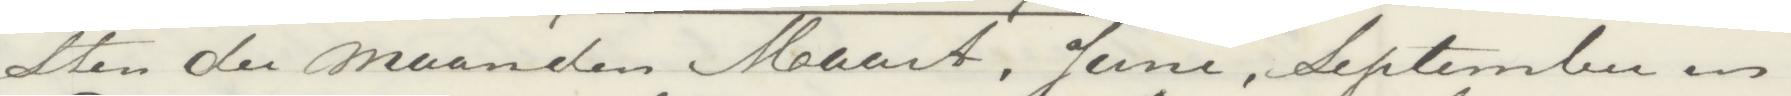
sten der maanden Maart, Juni, September en
